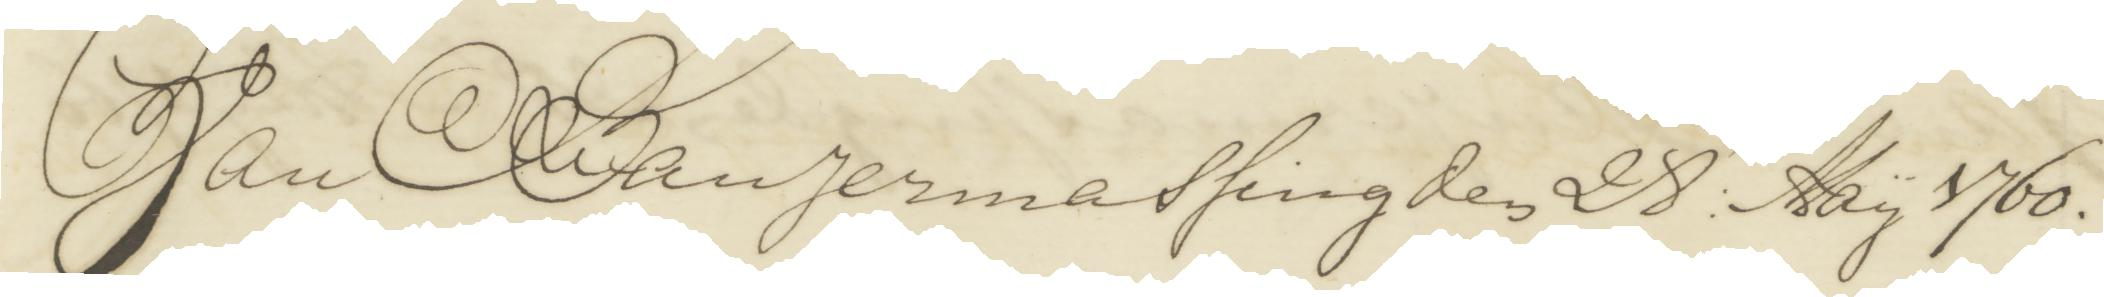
Van Banjermassing den 28:e Maij 1760.
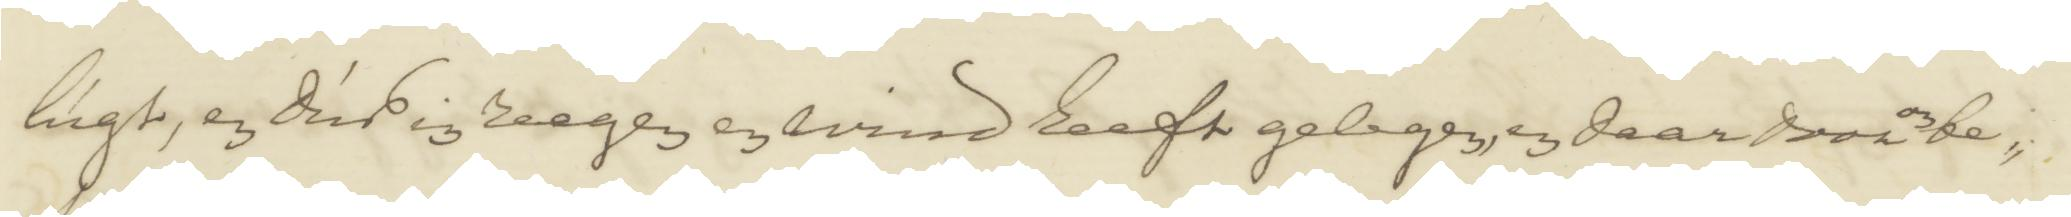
lugt, en dus in reegen en wind heeft gelegen, en daar door onbe„
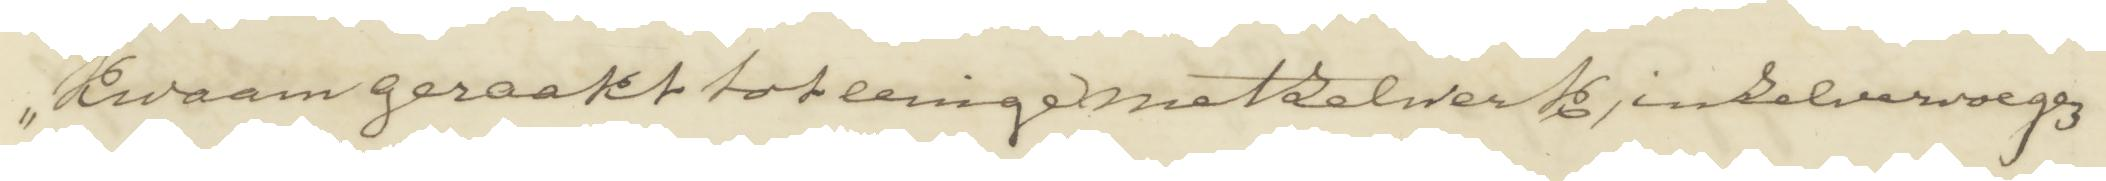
„kwaam geraakt tot eenige metzelwerk, in zelvervoegen
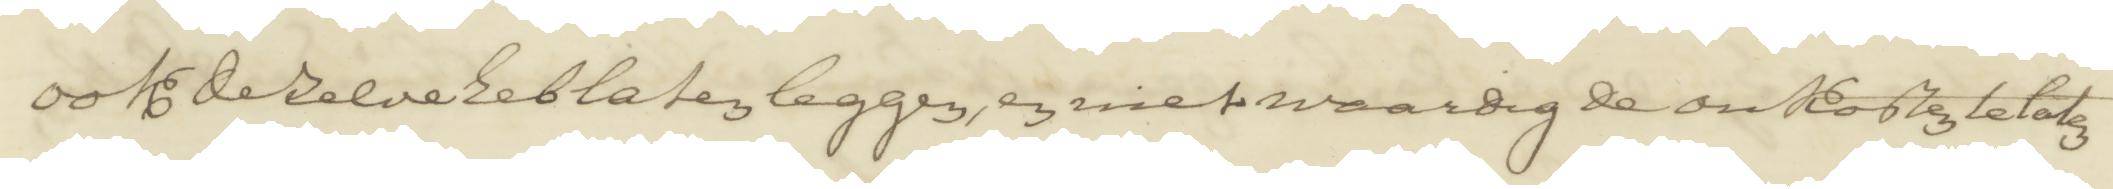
ook dezelve heb laten leggen, en niet waardig de onkosten te laten
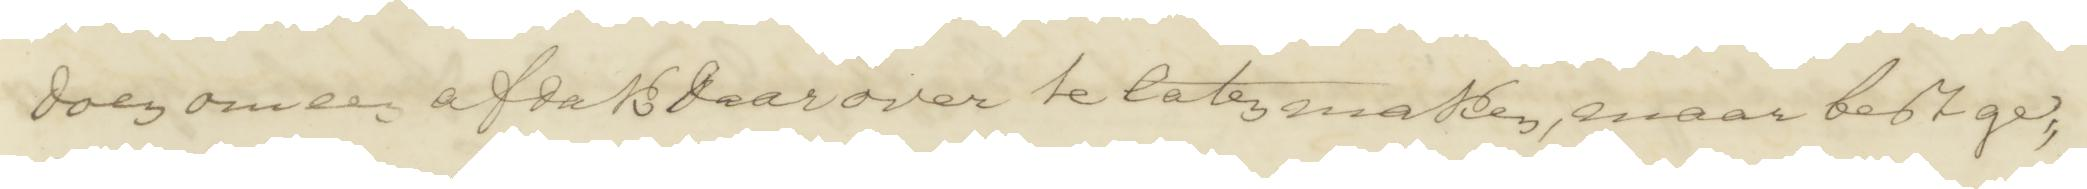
doen om een afdak daar over te laten maken, maar best ge„
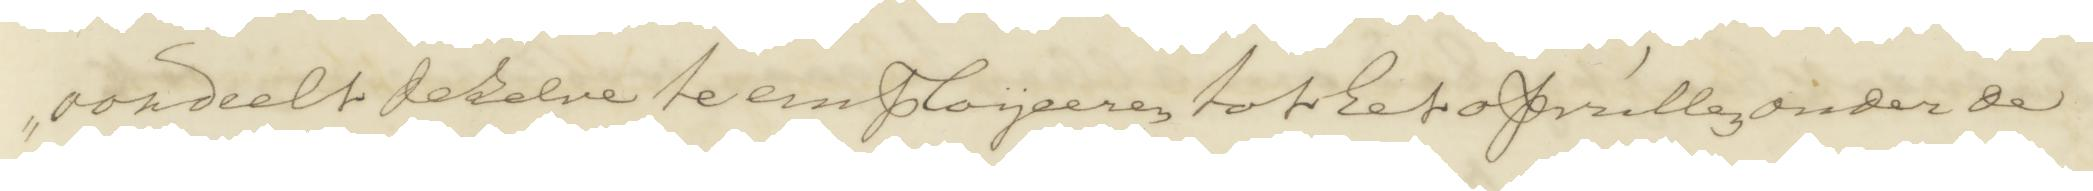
„oordeelt dezelve te emploijeeren tot het opvullen onder de
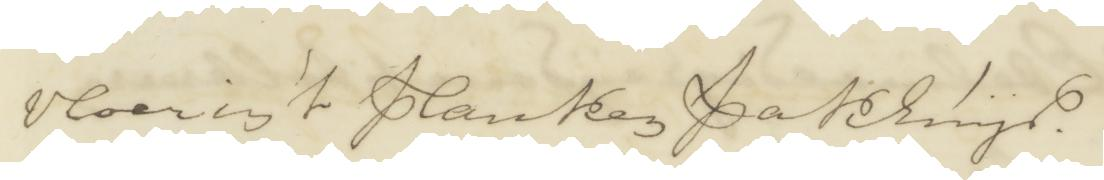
vloer in ’t planken pakhuijs.
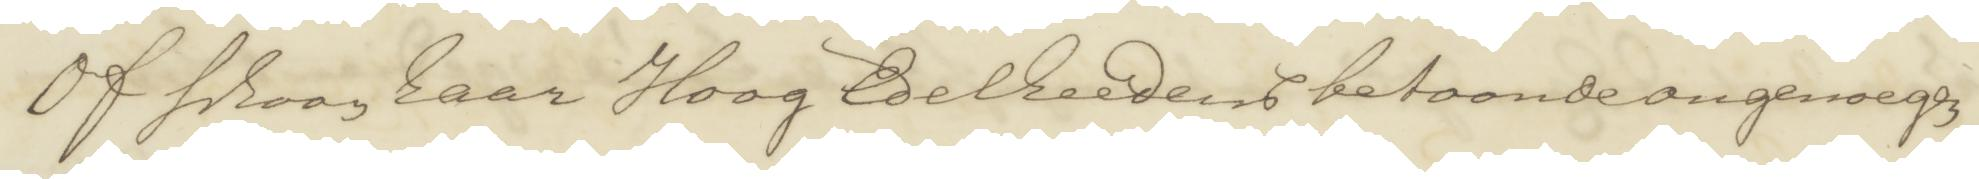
Of schoon haar Hoog Edelheedens betoonde ongenoegen
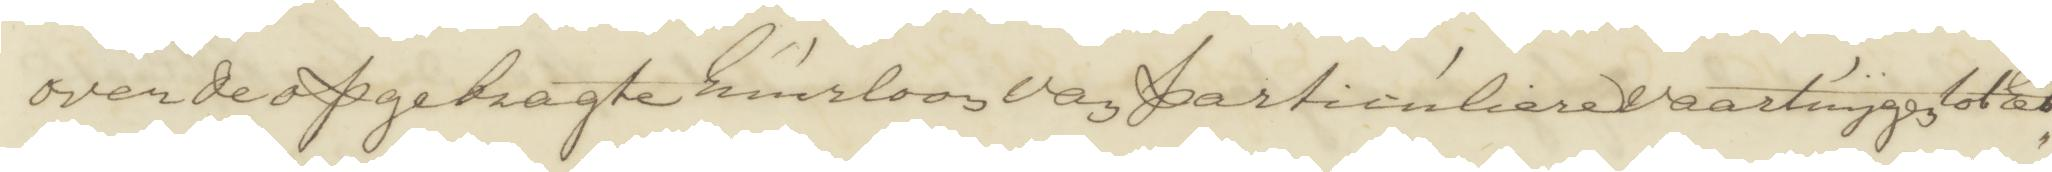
over de opgebragte huurloon van particuliere vaartuijgen tot het
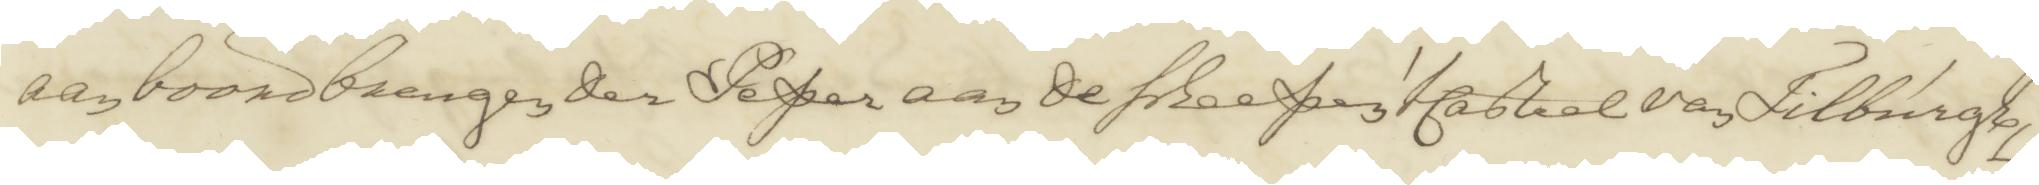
aan boord brengen der Peper aan de scheepen 't Casteel van Tilburgh,
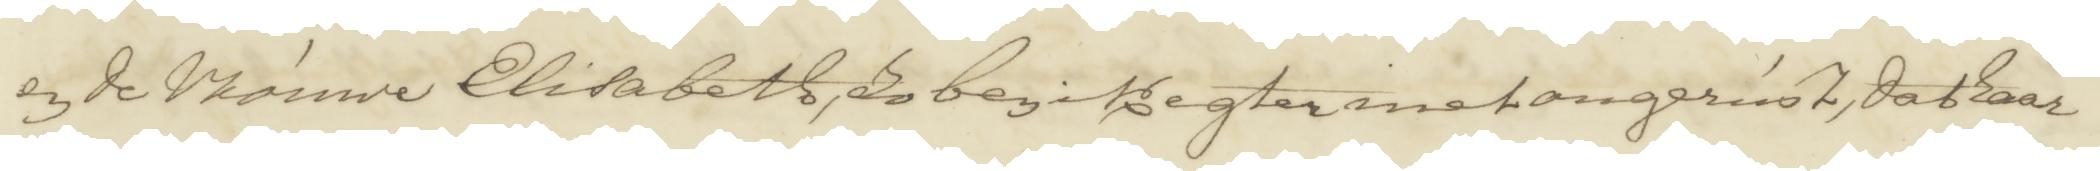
en de vrouwe Elisabeth, zo ben ik egter niet ongerust, dat haar
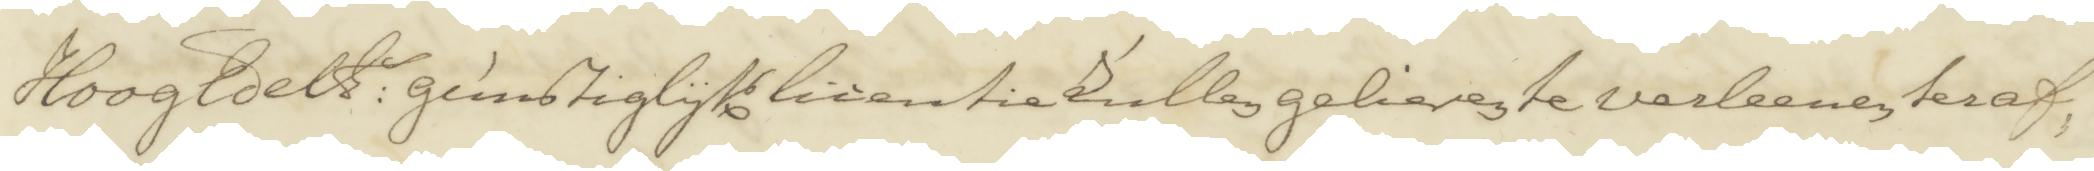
Hoog Edelh:s gunstiglijk licentie zullen gelieven te verleenen ter af„
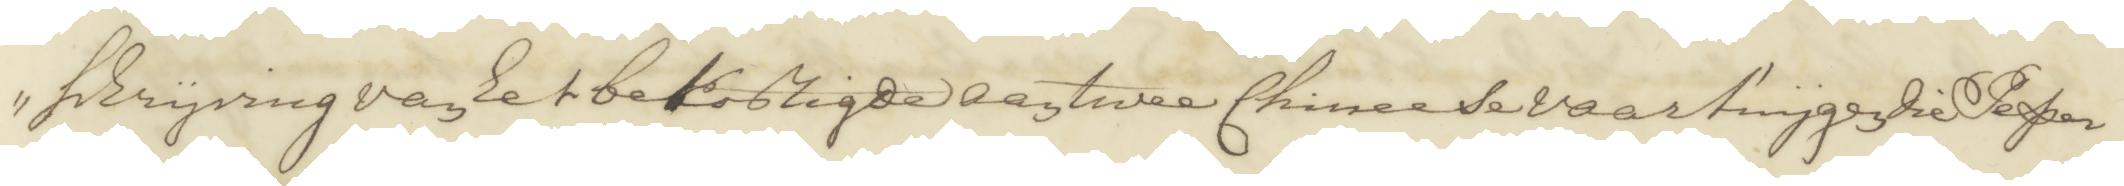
„schrijving van het bekostigde aan twee Chineese vaartuijgen die Peper
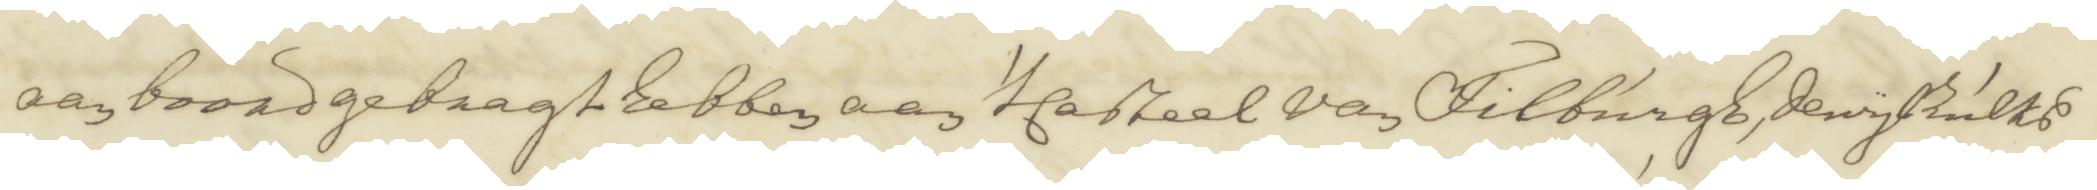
aan boord gebragt hebben aan ’t Casteel van Tilburgh, dewijl zulks
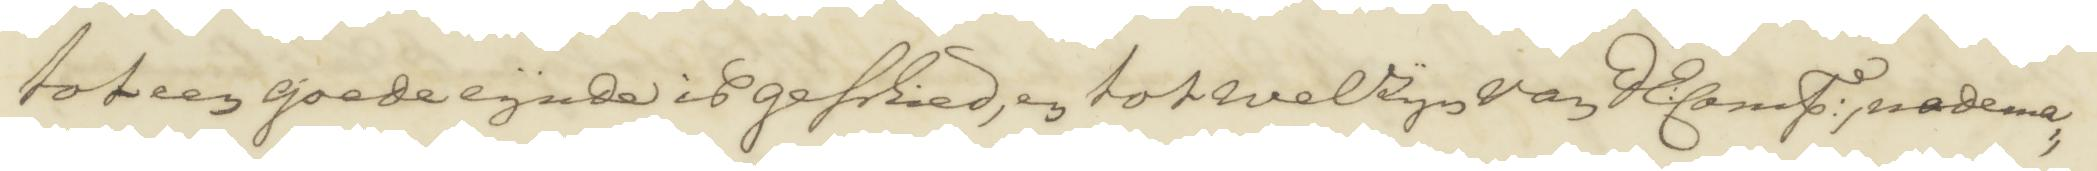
tot een goede eijnde is geschied, en tot welzijn van d'E:Comp:e, nadema„
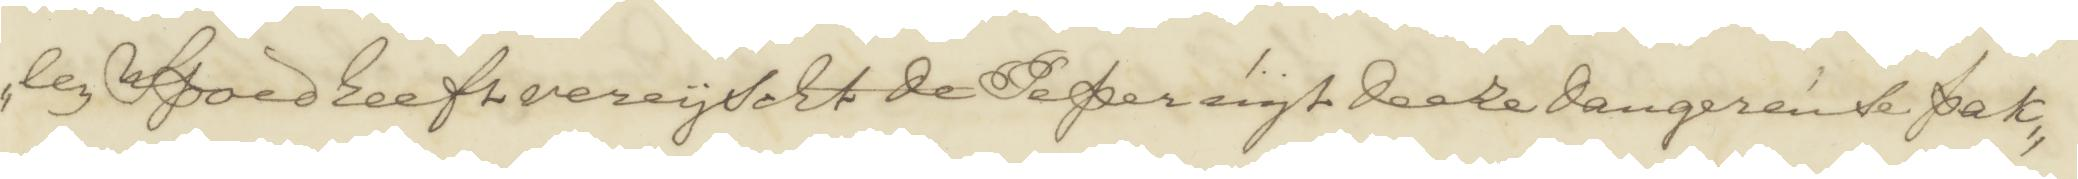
len spoed heeft vereijscht de Peper uijt deeze dangereuse pak„
